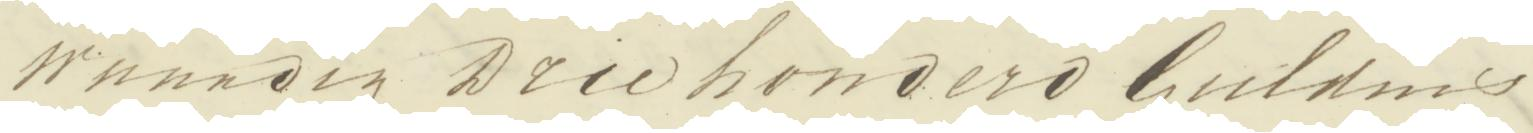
waardig Drie honderd Guldens
